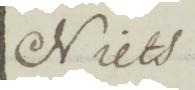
Niets
